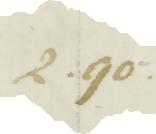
2.90:
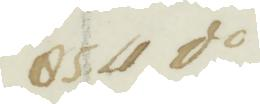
85. 4 do
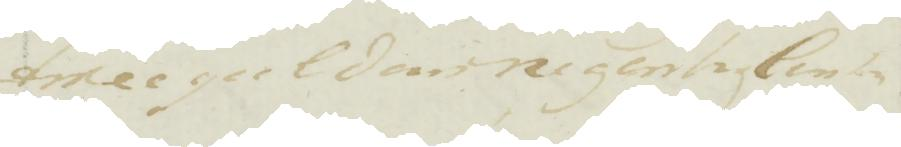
twee guldens negentig Cents
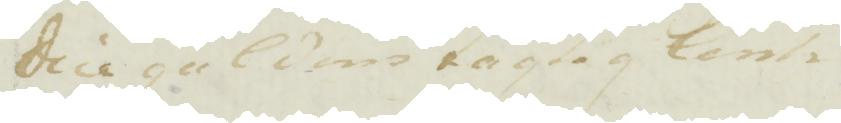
drie guldens tagtig Cents.
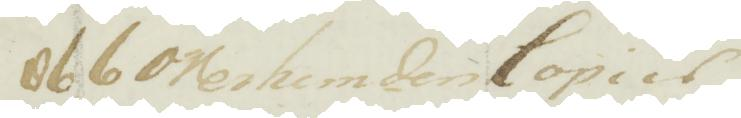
86 6 Overhemden Copier
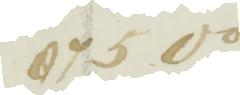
87 5 do
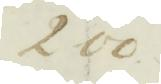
2.00.
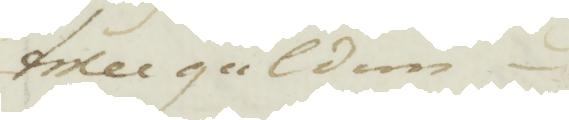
twee guldens —
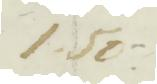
1.50:
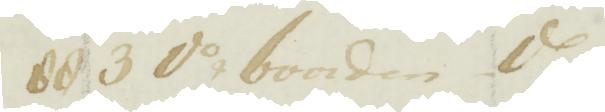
88 3 d„o boorden d_o
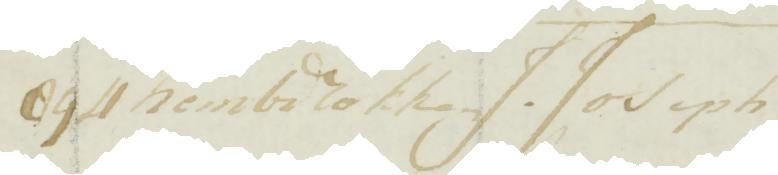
89 4 hembdrokke J. Joseph.
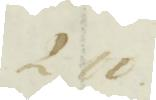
2.10.
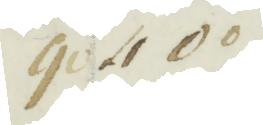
90 4 do
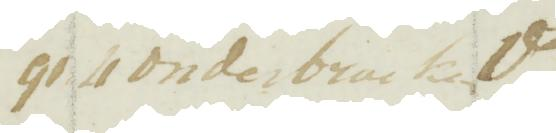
91 4„ onderbroeken d_o
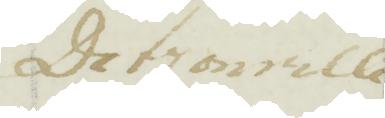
Detjonville
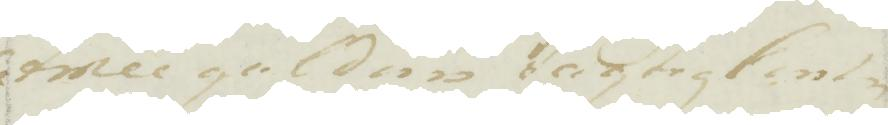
twee gulden tagtig Cents
